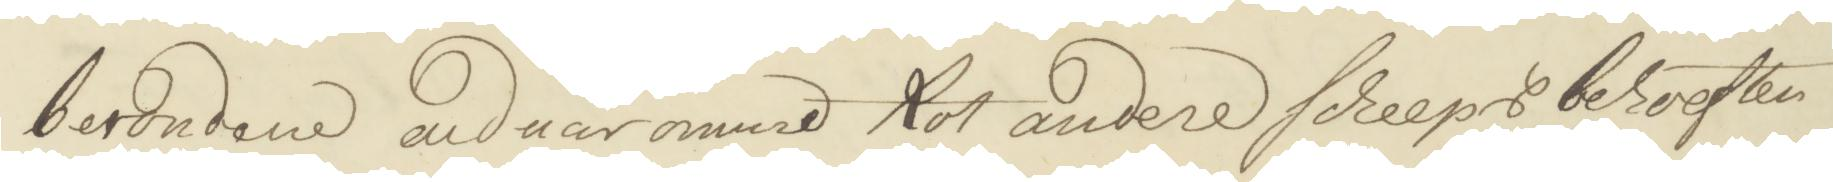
bevondene endaar omme tot andere scheeps behoeften
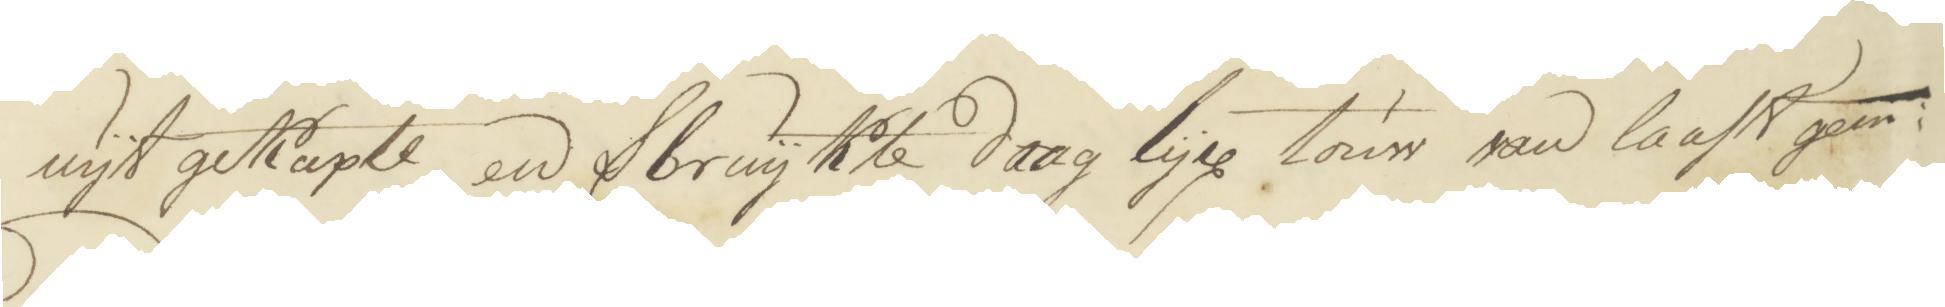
uijt gekapte, en verbruijkte daag lijx touw van laast gem:
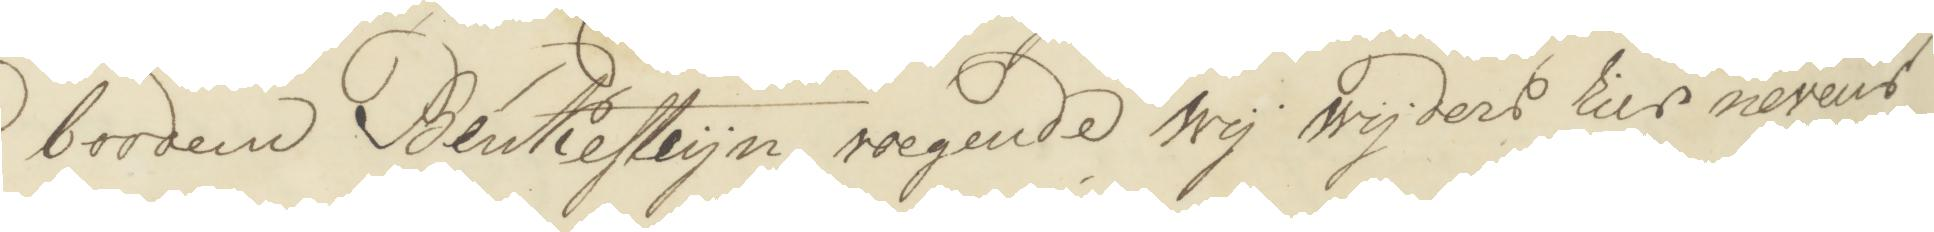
boodem Beukesteijn, voegende wij wijders hier nevens
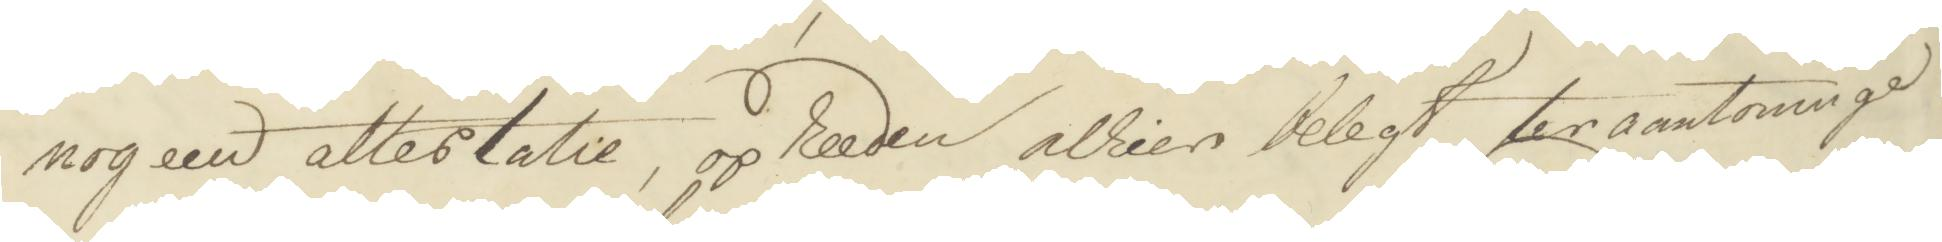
nog een attestatie, op heeden alhier belegt ter aantoninge
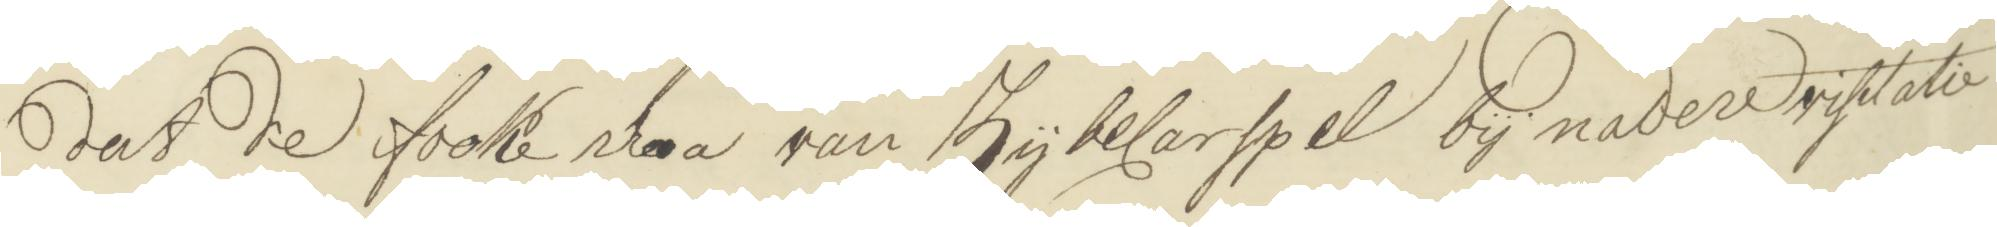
dat de focke rhaa van zij becarspel bij nadere vistatie
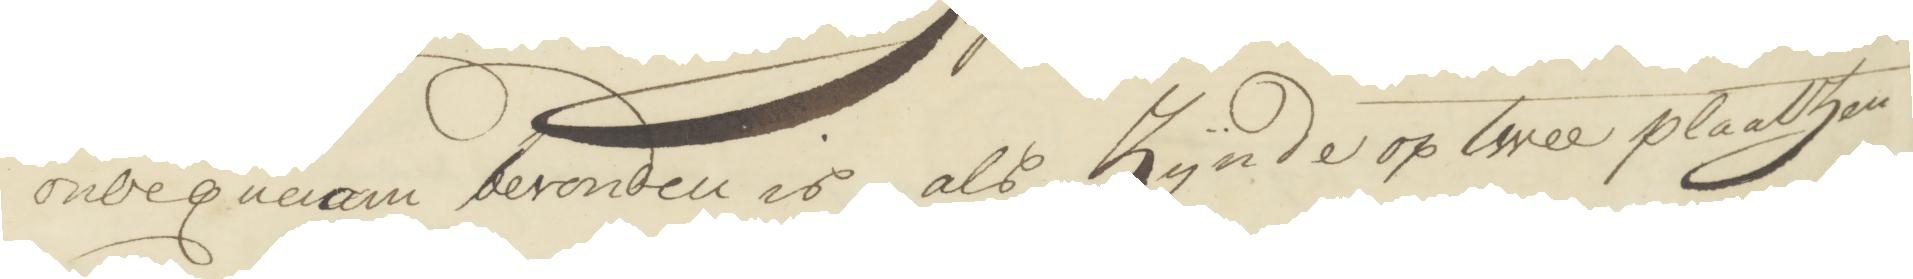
onbequaam bevonden is, als zijnde op twee plaatzen
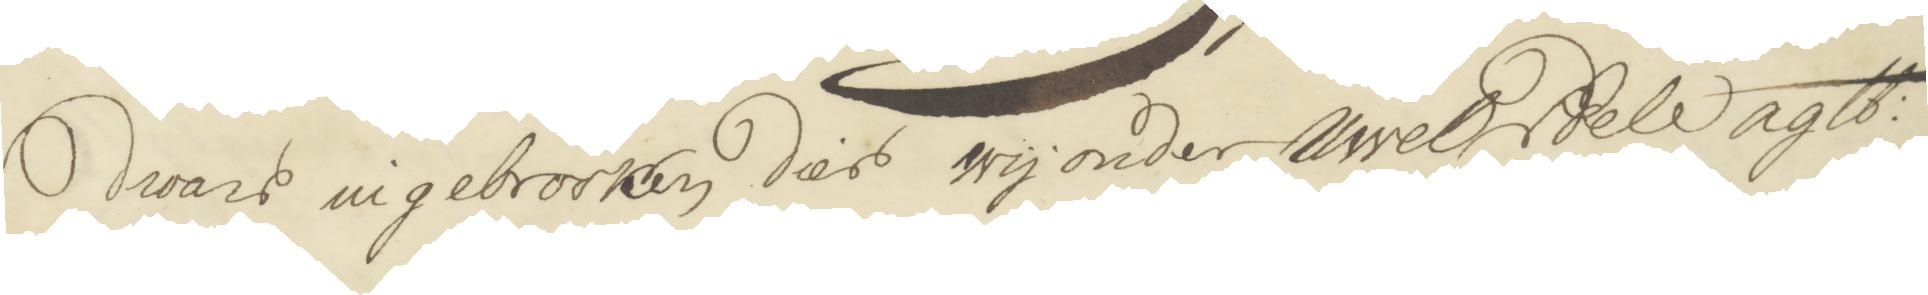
dwars ingebrooken dies wij onder Uwel Edele agtb:
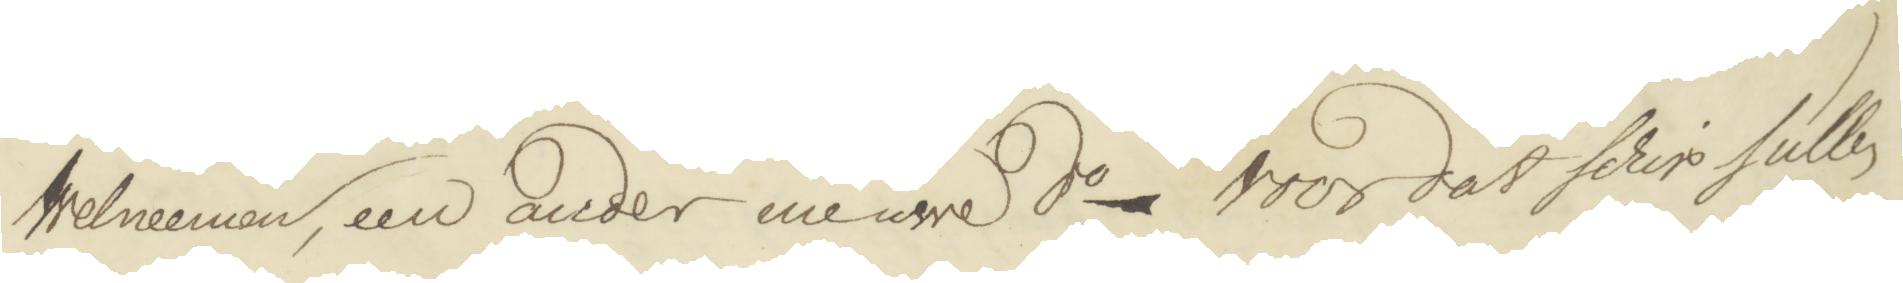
Welneemen, een ander nieuwe d-o voor dat schip sullen
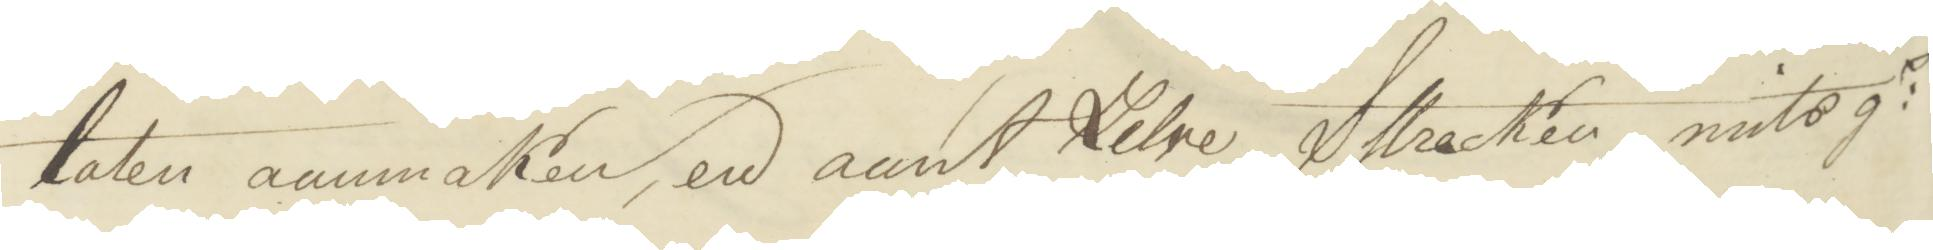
laten aanmaken, en aan'tzelve verstrecken, mitsg:s
